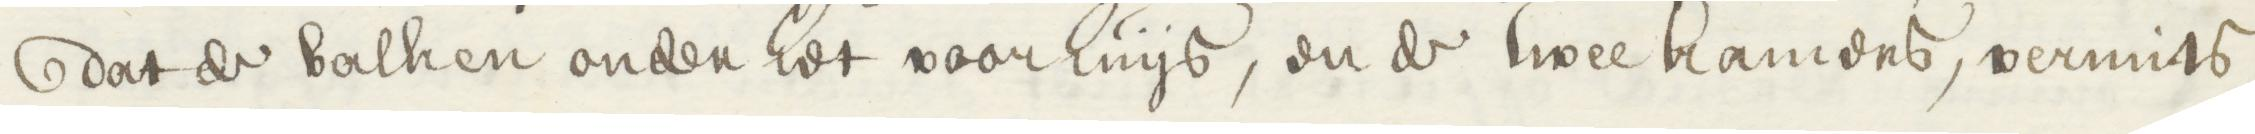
dat de balken onder het voorhuijs, en de twee kamers, vermits
